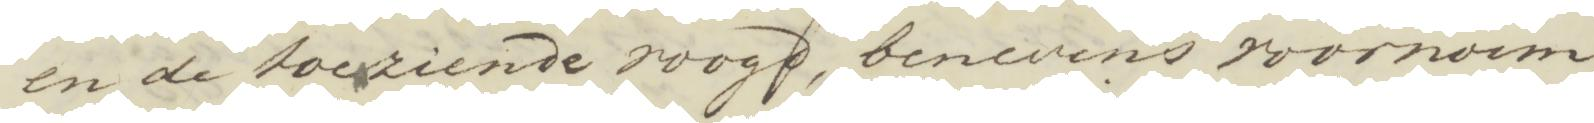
en de toeziende voogd, benevens voornoem:
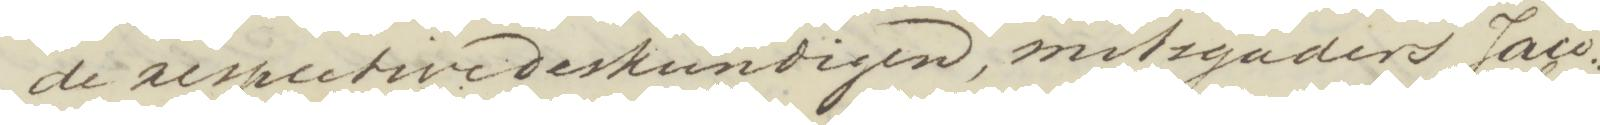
=de respective deskundigen, mitsgaders Jaco:
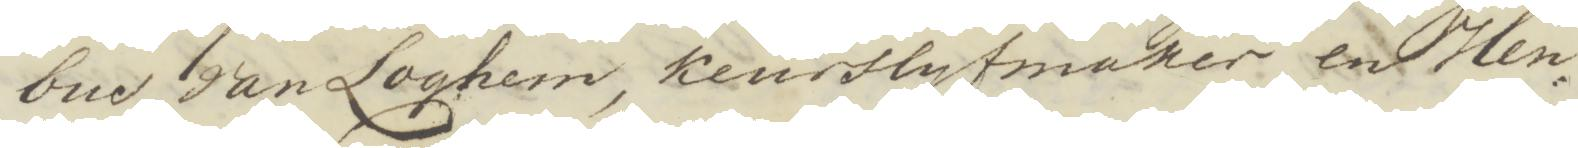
=bus van Loghem, keurslyfmaker, en Hen:
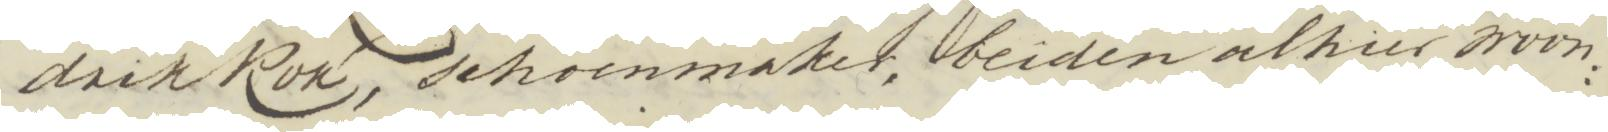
=drik Kok, schoenmaker, beiden alhier woon:
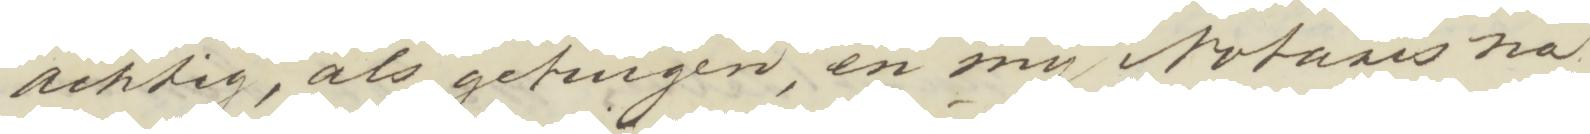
=achtig, als getuigen, en my Notaris na
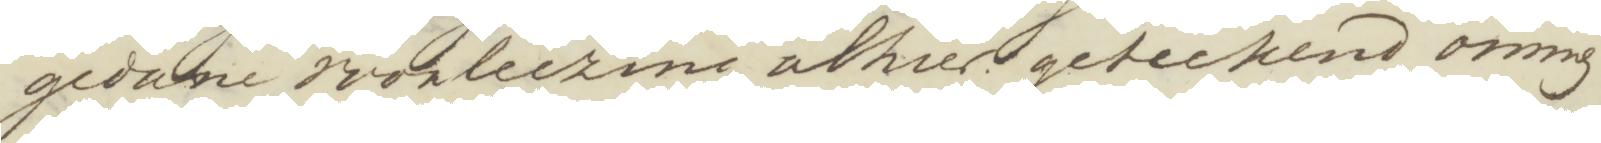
gedane voorleezing alhier geteekend ommen
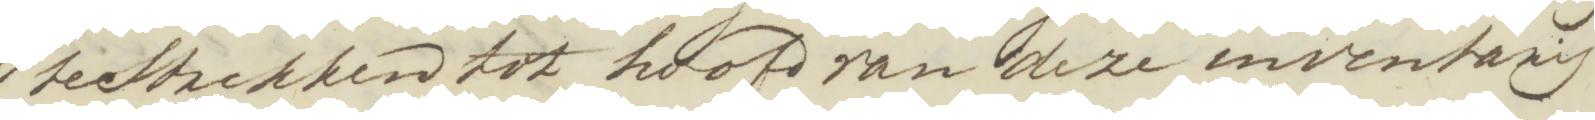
te strekken tot hoofd van deze inventaris
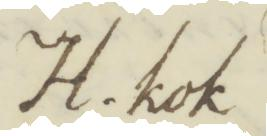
H. kok
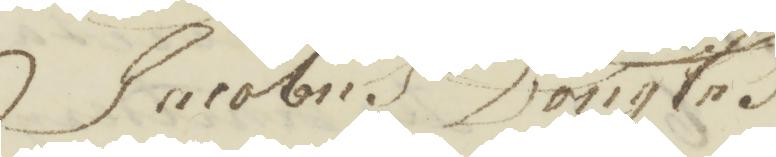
Jacobus Douglas
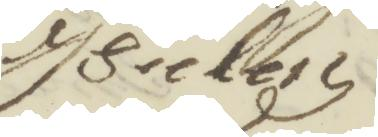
J Seelen
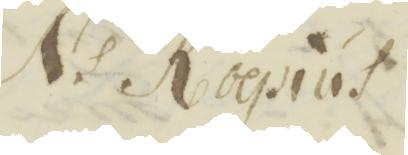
N.s Roepius
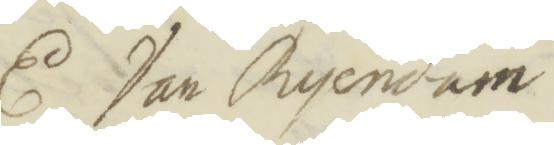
E Van Ryendam
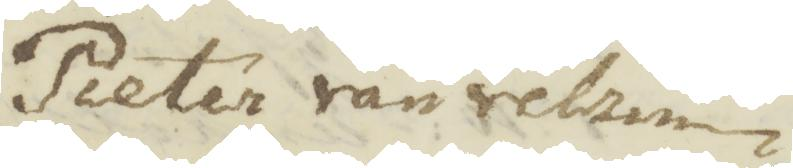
Pieter van velzen
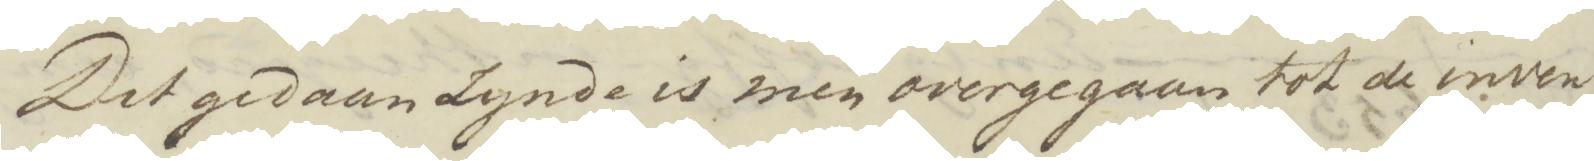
Dit gedaan zynde, is men overgegaan tot de inven:
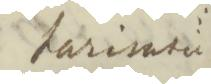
tarisatie
